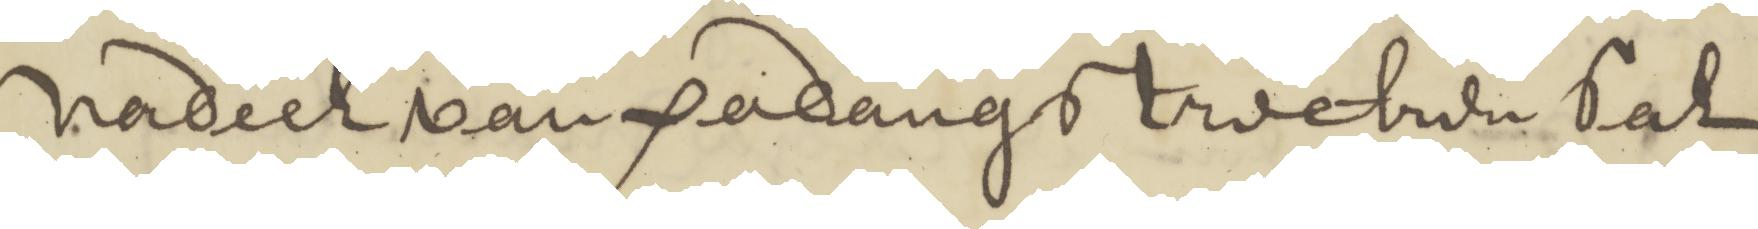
nadeel van padangstreeken sal
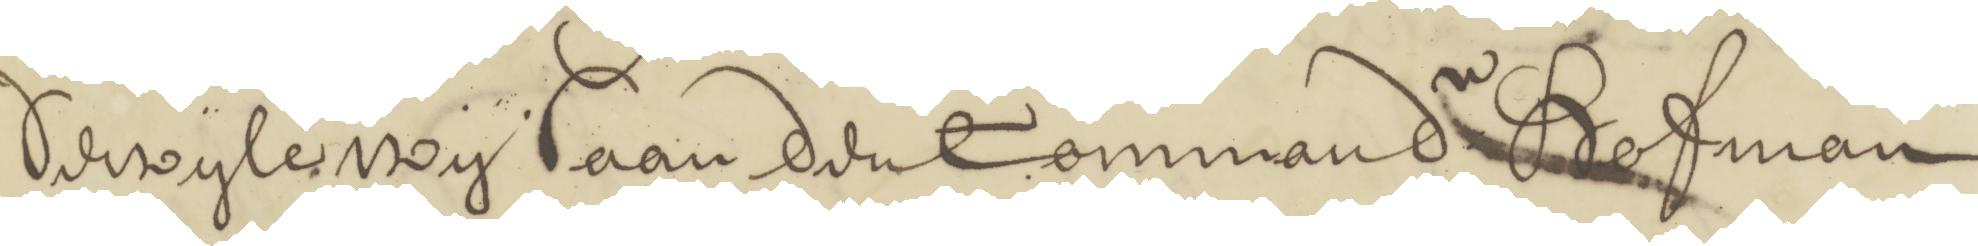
dewijle wij 't aan den Command:r Hofman
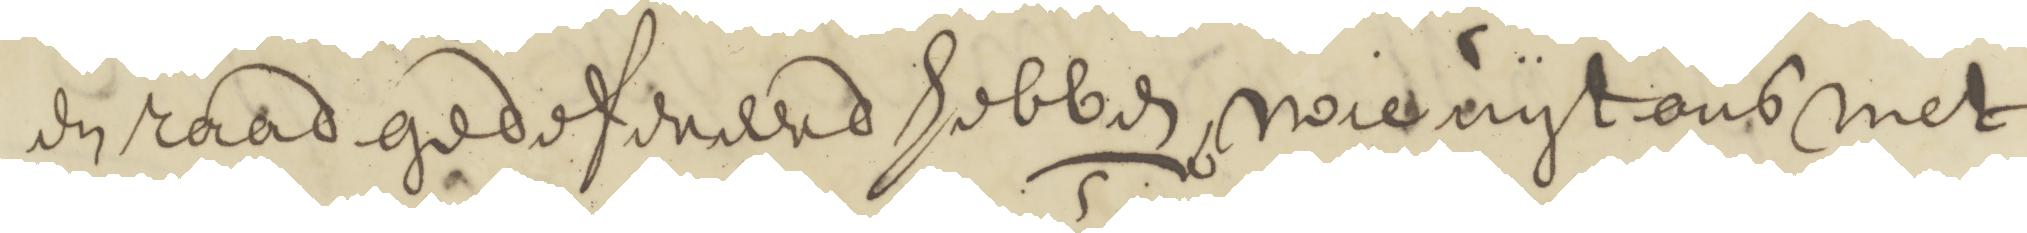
en raad gedefereerd hebben, wie uijt ons met
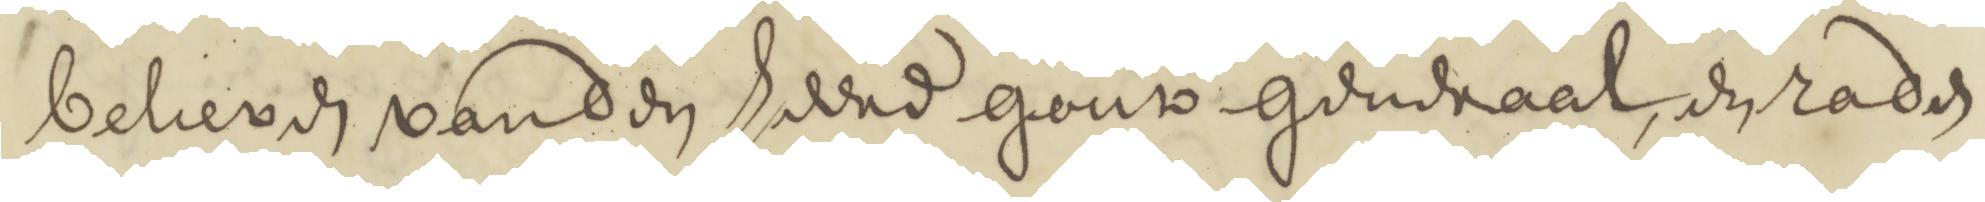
believen van den heere gouvr generaal, en raden
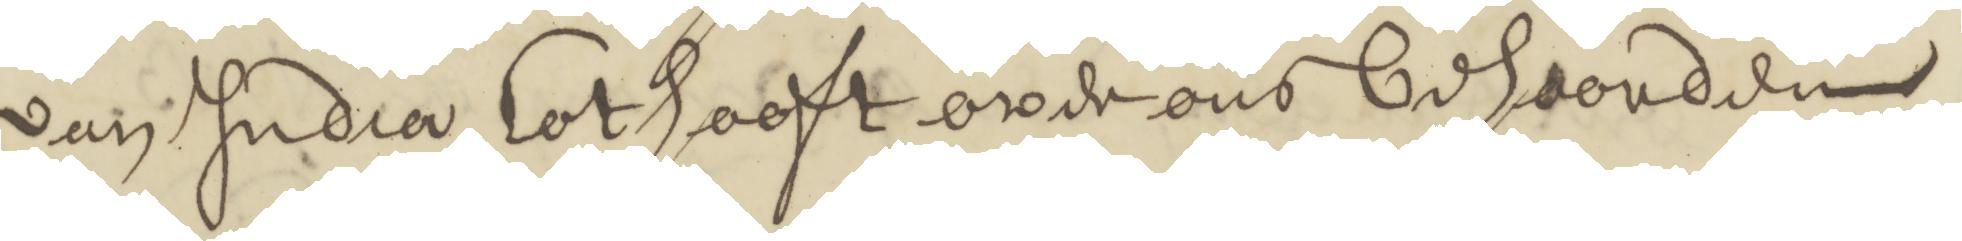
van Jndia, tot hooft over ons behoorden
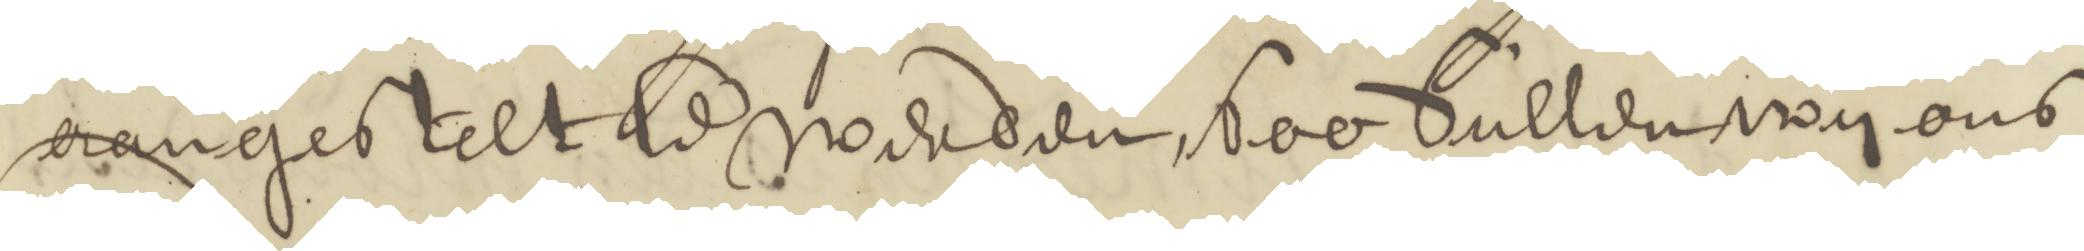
aangestelt te werden, soo sullen wij ons
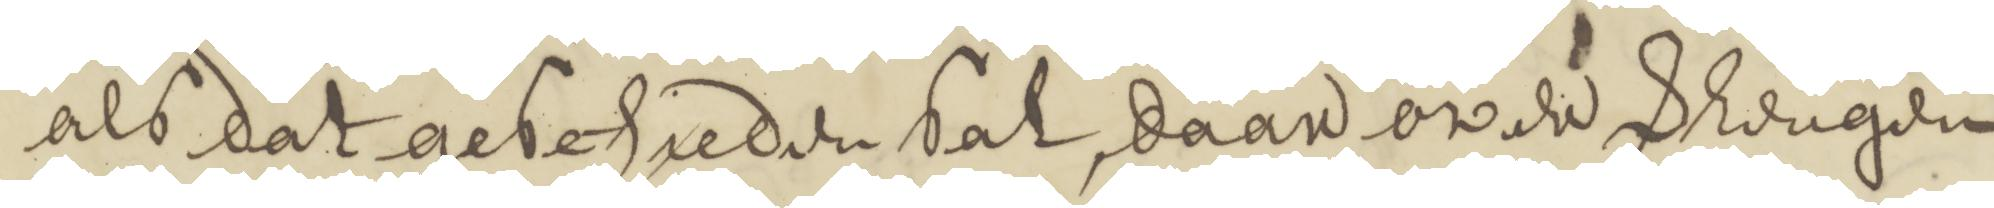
als dat geschieden sal, daar over verheugen
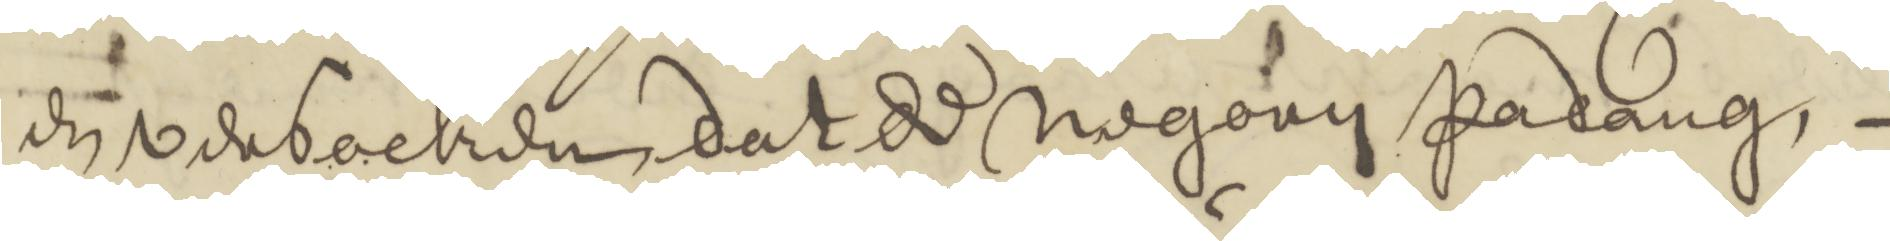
en versoeken, dat de negorij padang,
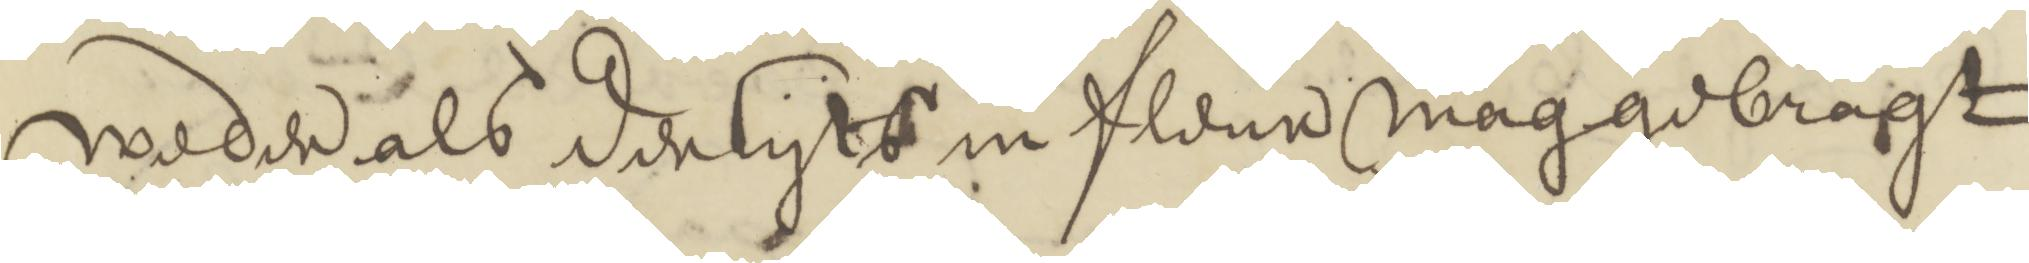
weder als Eertijts in fleur mag gebragt
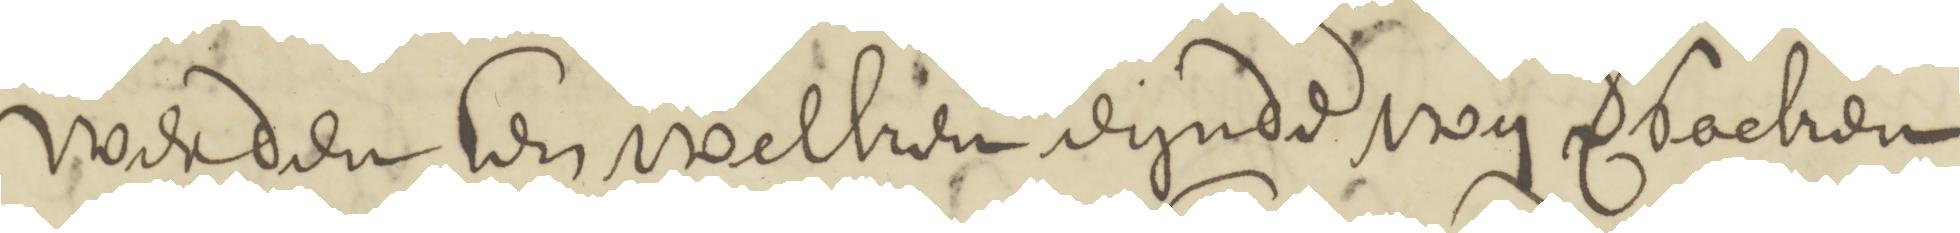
werden, ten welken eijnde wij versoeken
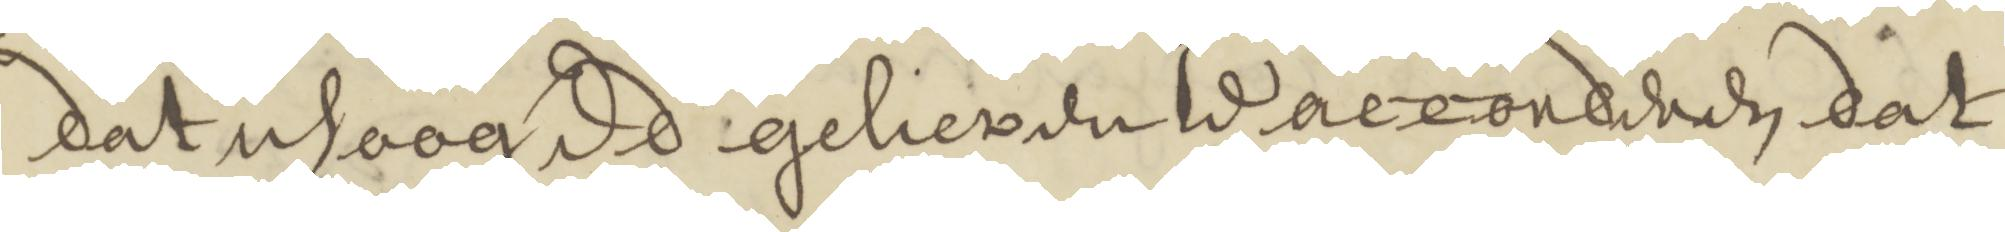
dat uhoog Ed. gelieven te accorderen dat
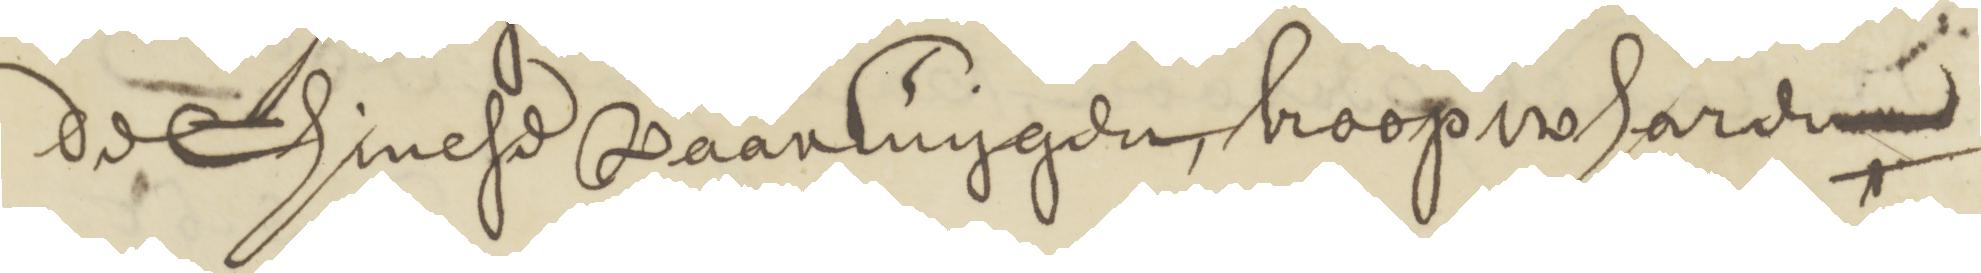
de Chinese vaartuijgen, koopwharen
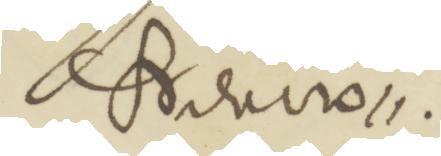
Herw„t.
